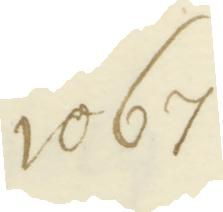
1067
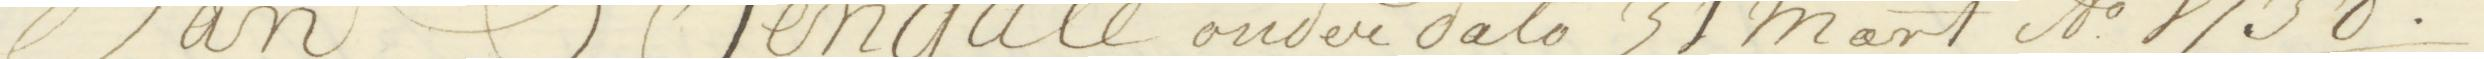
Van Bengale onder dato 31 Mart A.o 1738.
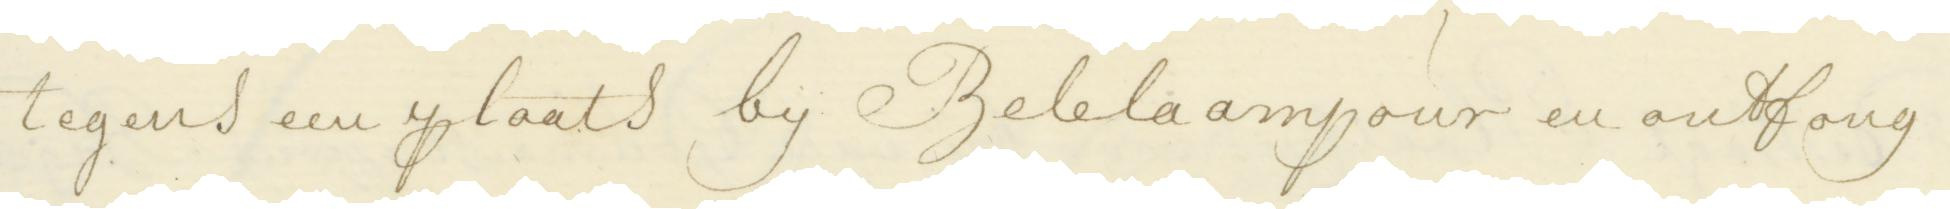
tegens een plaats bij Belelaampour en ontfong
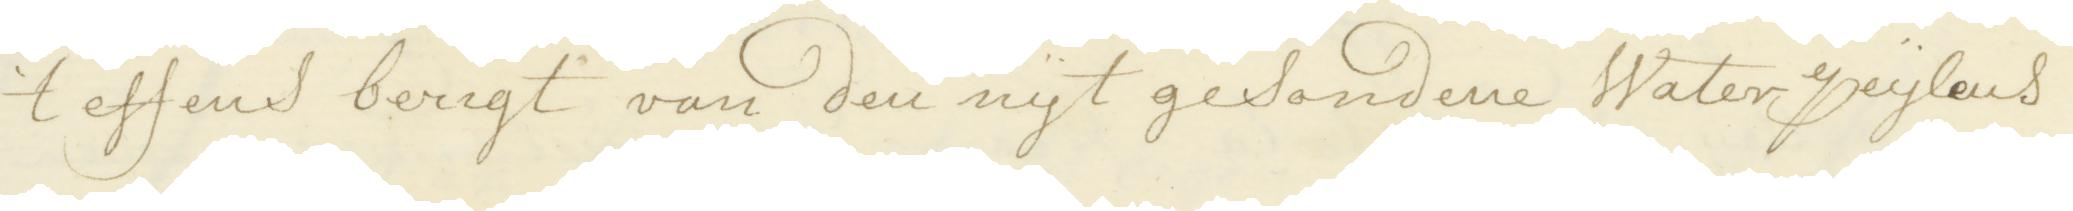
’t effens berigt van den uijt gesondene Water peijlens
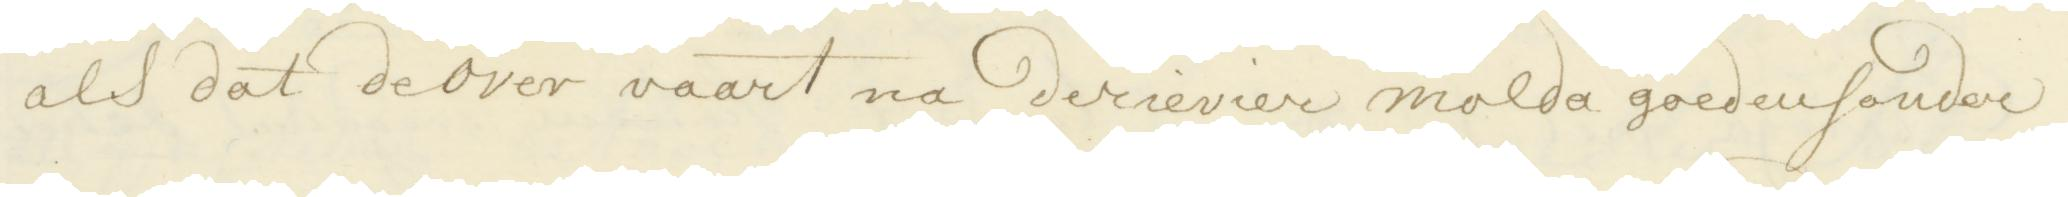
als dat de over vaart na de rievier molda goed en sonder
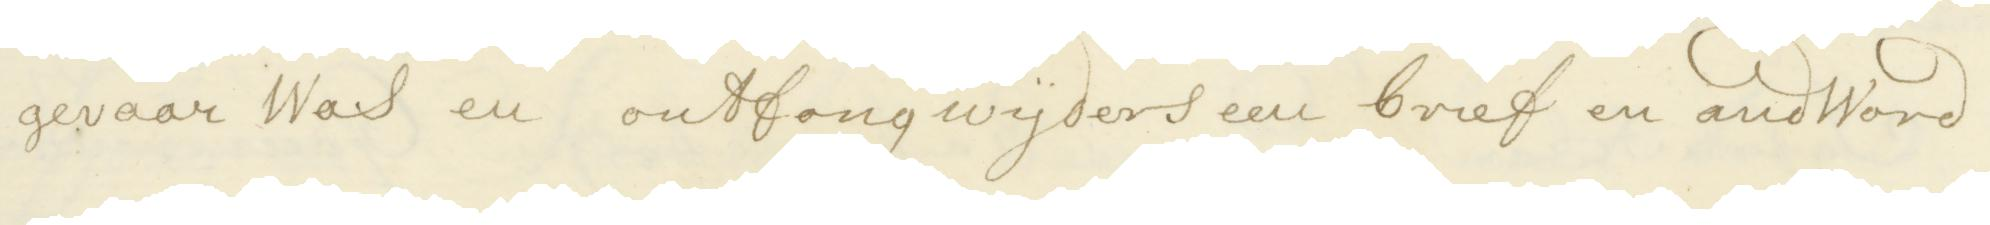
gevaar was en ontfong wijders een brief en andword
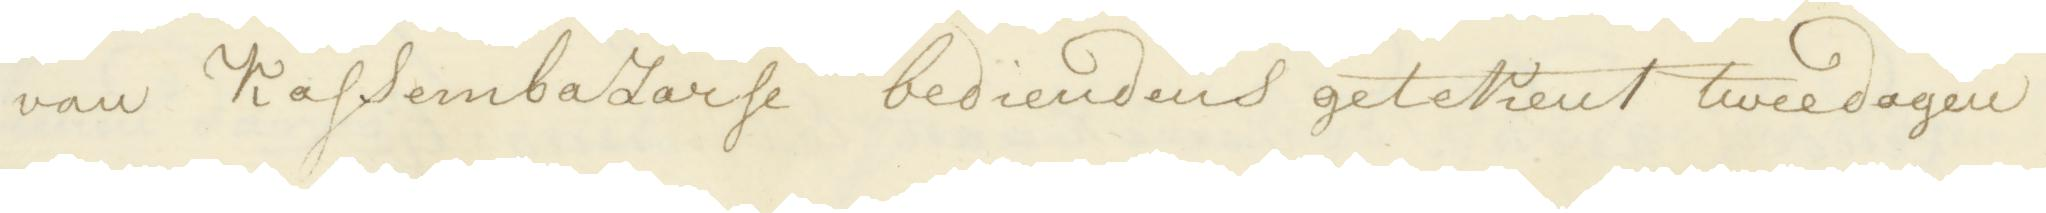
van Kassembazarse bediendens getekent tweedagen
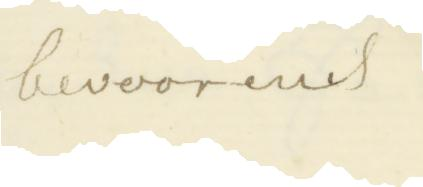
bevoorens
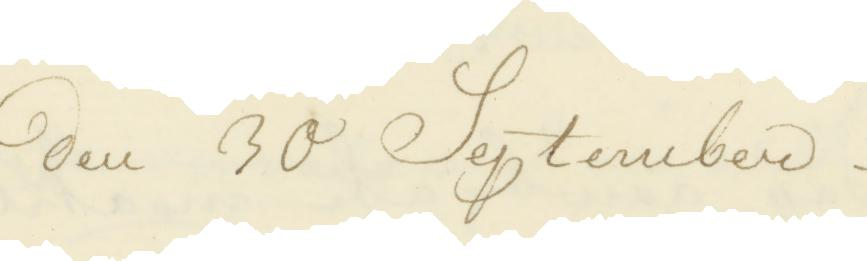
den 30 September
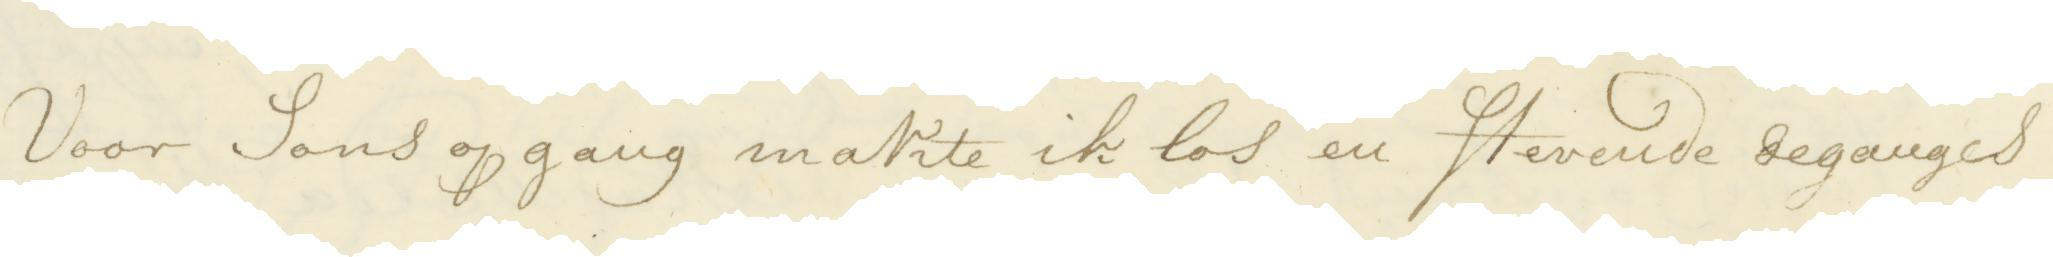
Voor Sons opgang makte ik los en stevende deganges
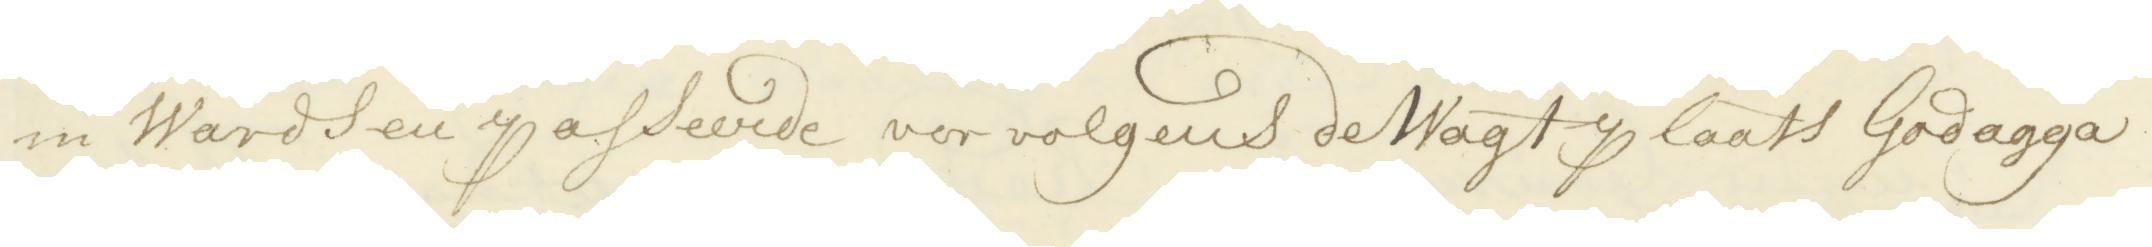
in wards en passeerde vervolgens de wagtplaats Godagga
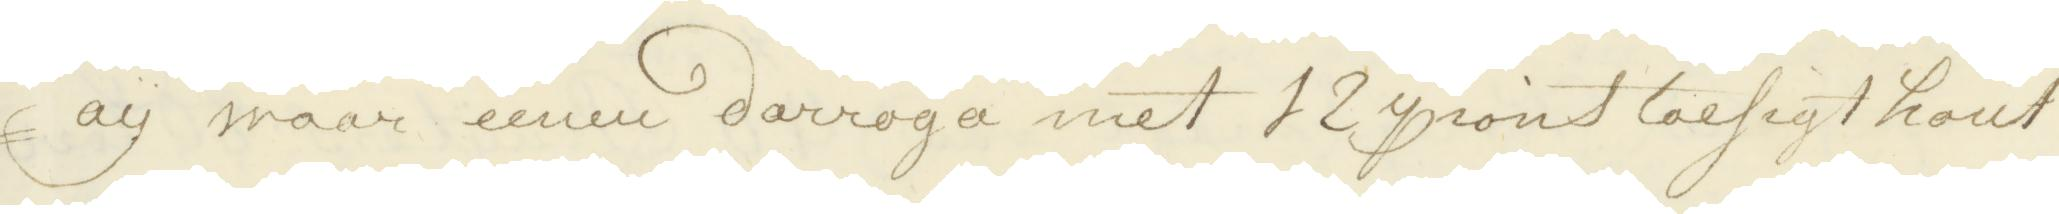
=aij waar eenen darroga met 12 pions toesigt hout
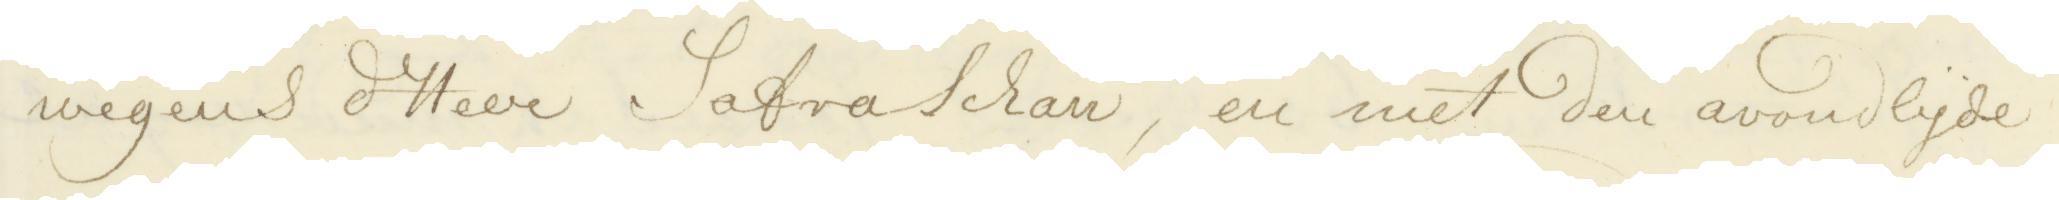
wegens dHeer Safraschan, en met den avondlijde
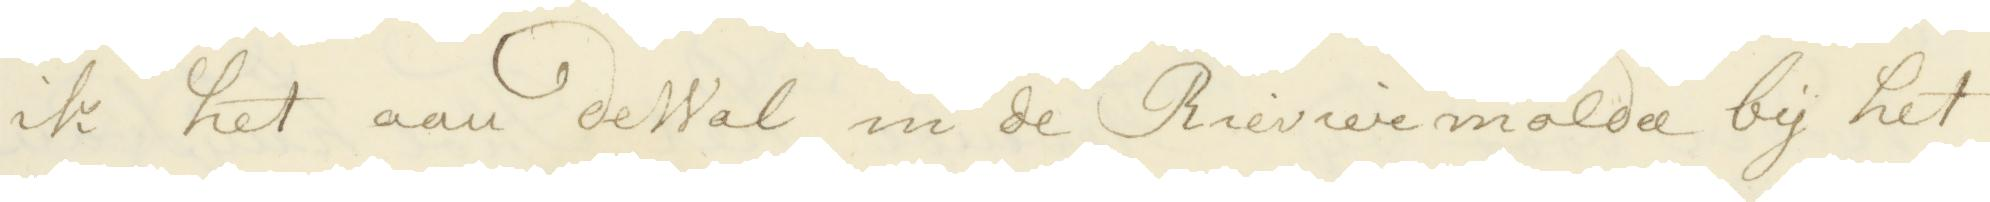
ik het aan de Wal in de Rievier maldee bij het
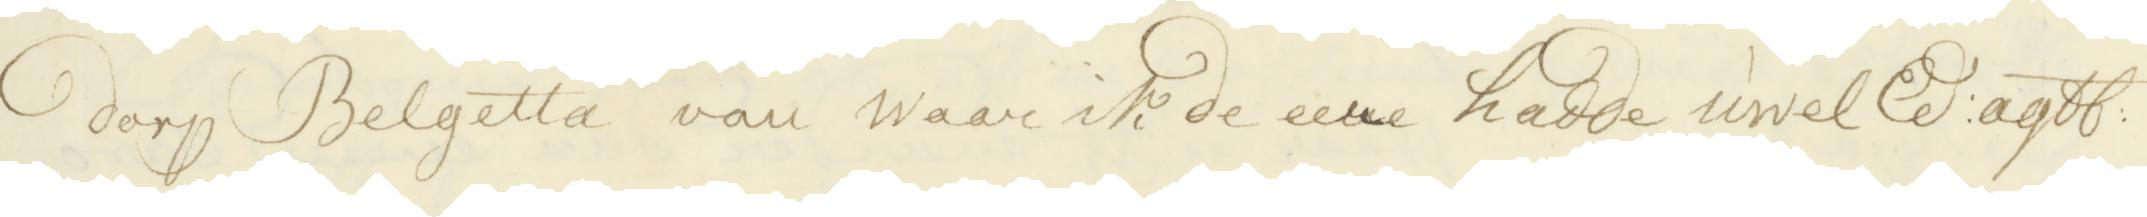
dorp Belgetta van waar ik de eene hadde uwel Ed: agtb:
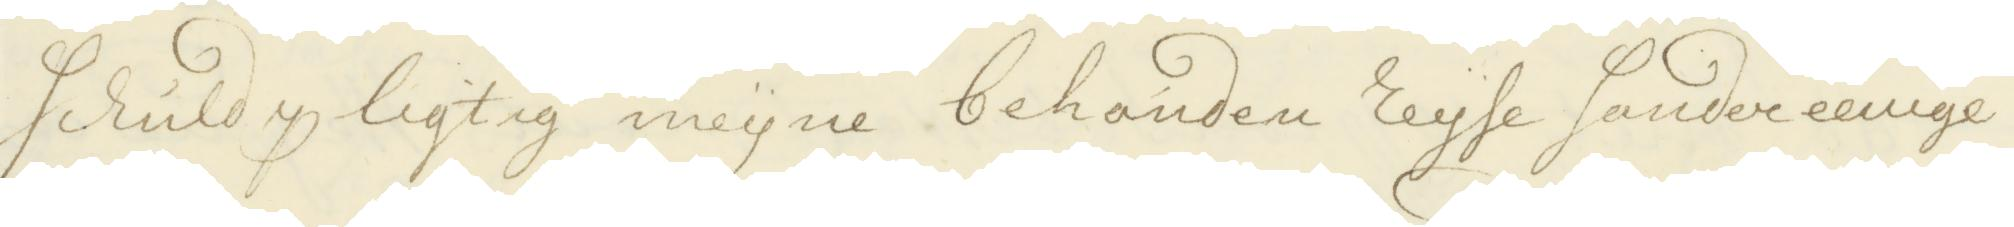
schuldpligtig meijne behouden reijse sonder eenige
